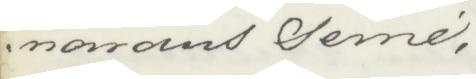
nardus Semé,
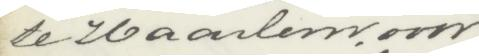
te Haarlem, voor
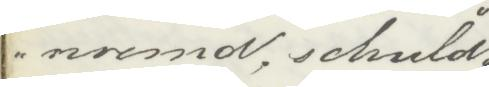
„noemd, schuld.
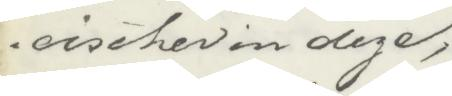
„eischer in deze,
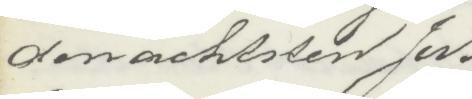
den achtsten Ju
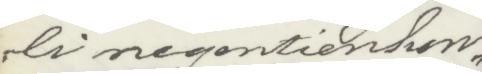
„li negentienhon„
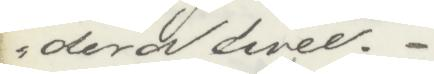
„derd twee.-
